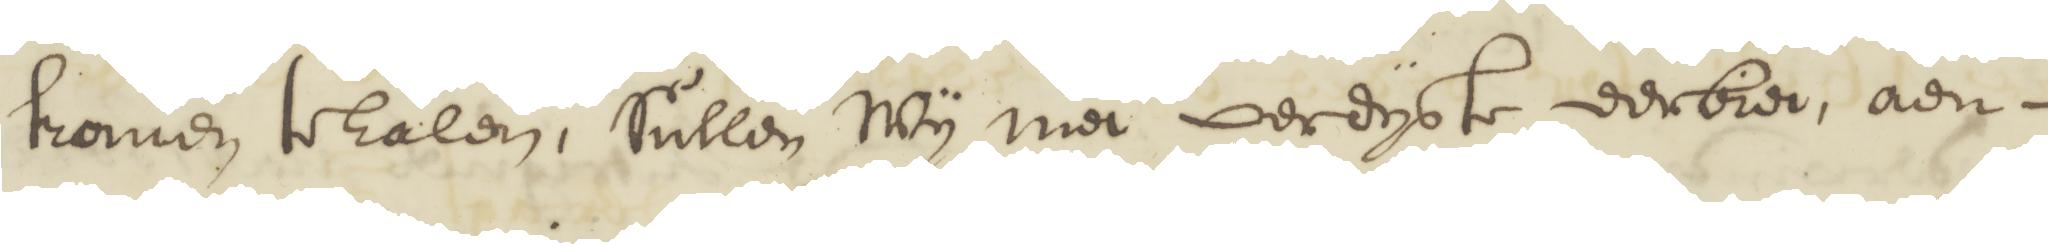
komen tehalen, sullen wij met vereijste eerbiet, aen
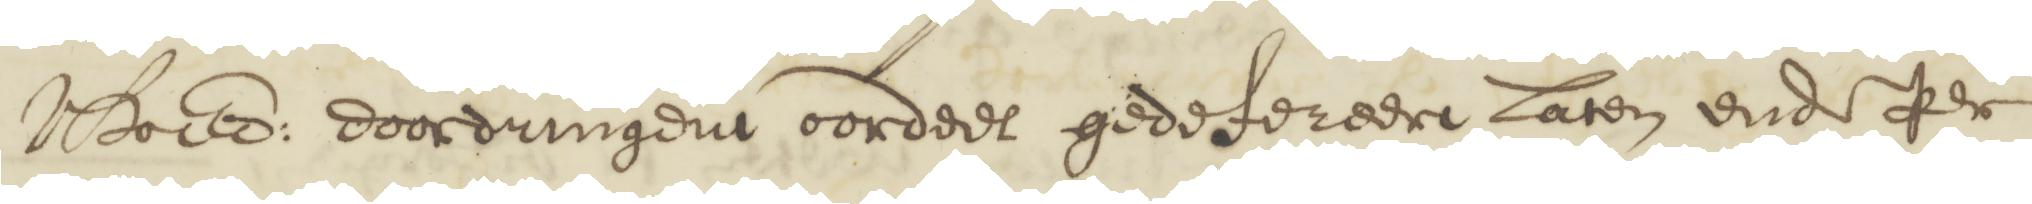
VHoEd: doordringent oordeel gedefereert laten ende per
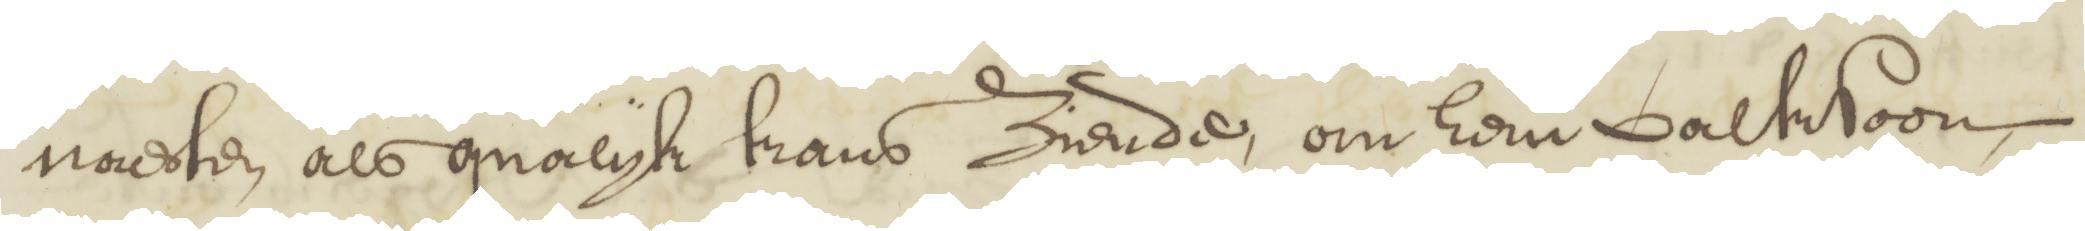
naesten als qualijk kans ziende, om hem valksoon
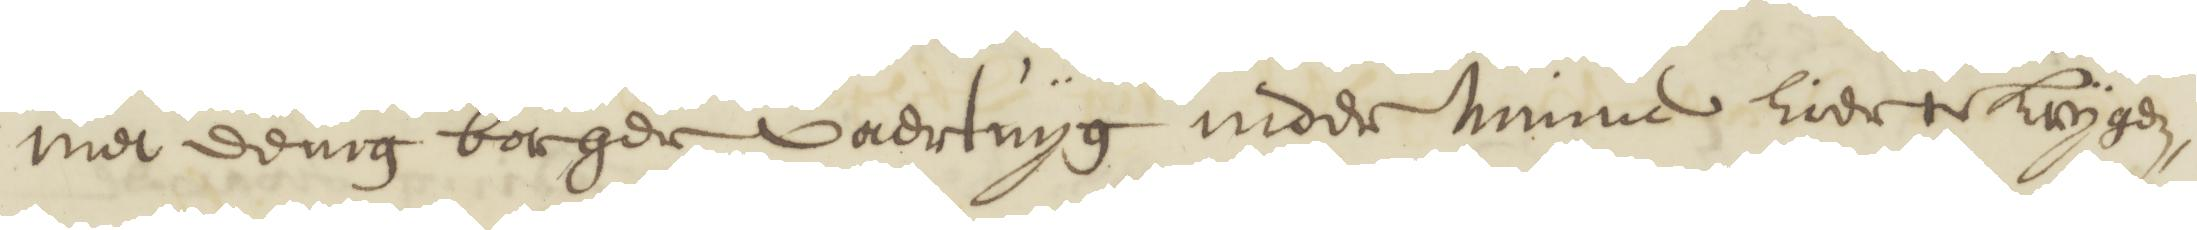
met eenig borger vaertuijg inder minne hier te krijgen
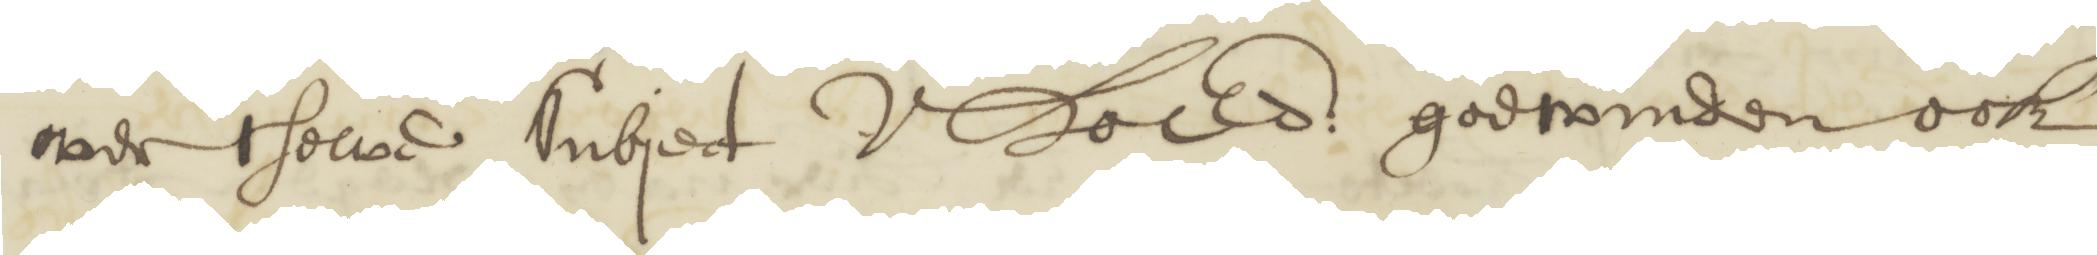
over 't selve subject VHoEd: goetvinden ook
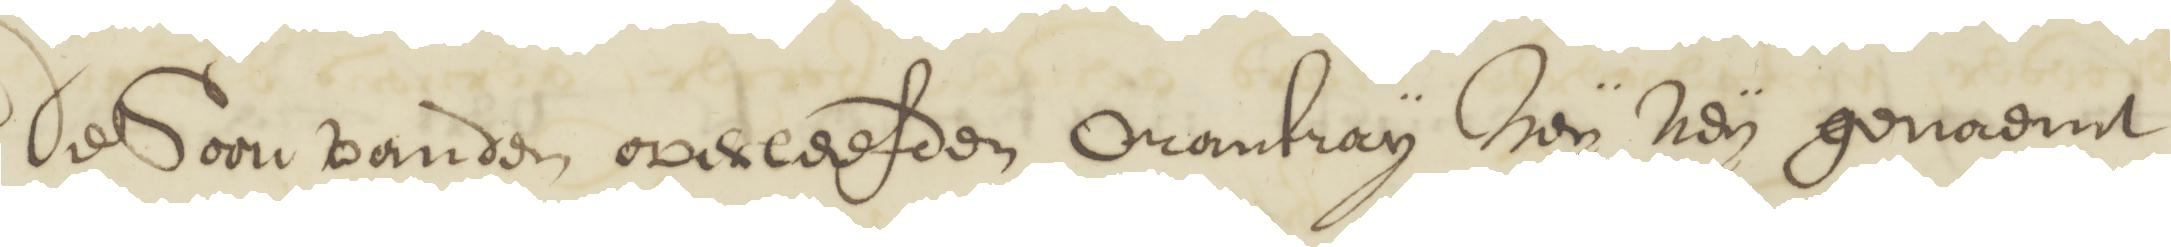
de Soon van den overleefden Orankaij Neij Neij genaemt
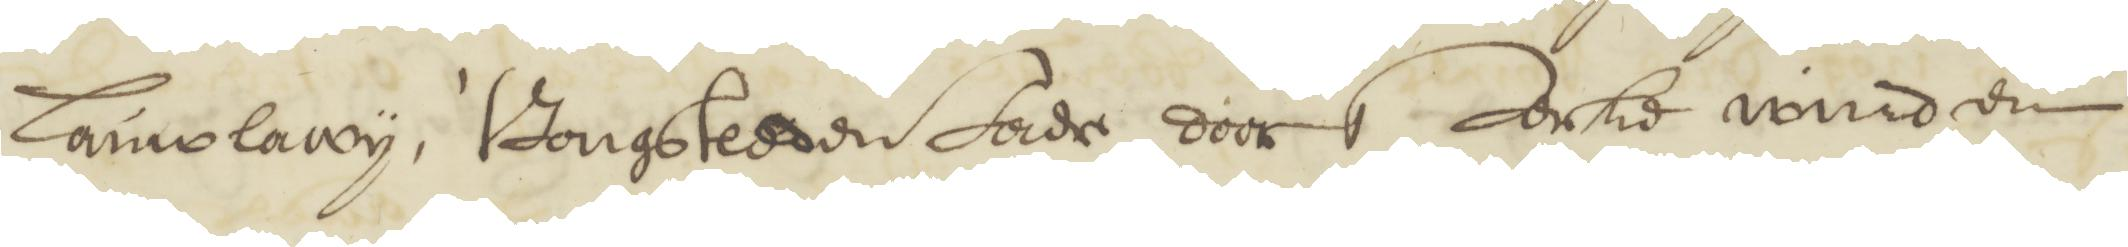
lauw lawij, 't Iongstleden Iaer door sterke wind en
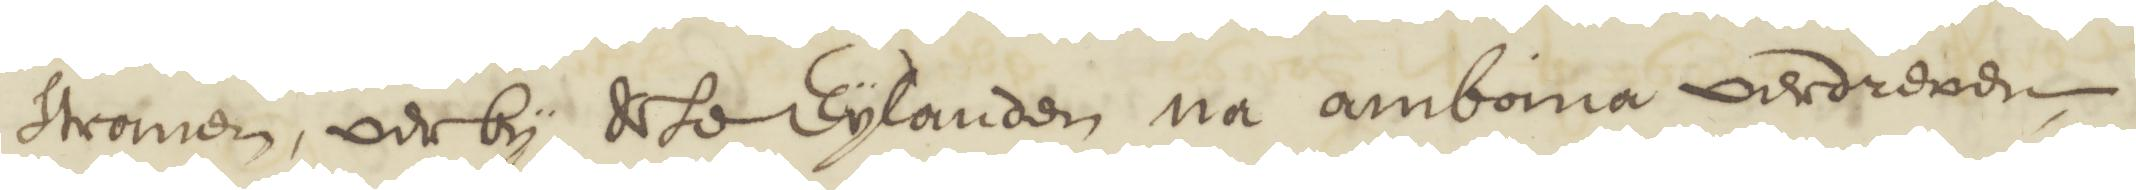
stromen, verbij dese Eijlanden na amboina verdreven,
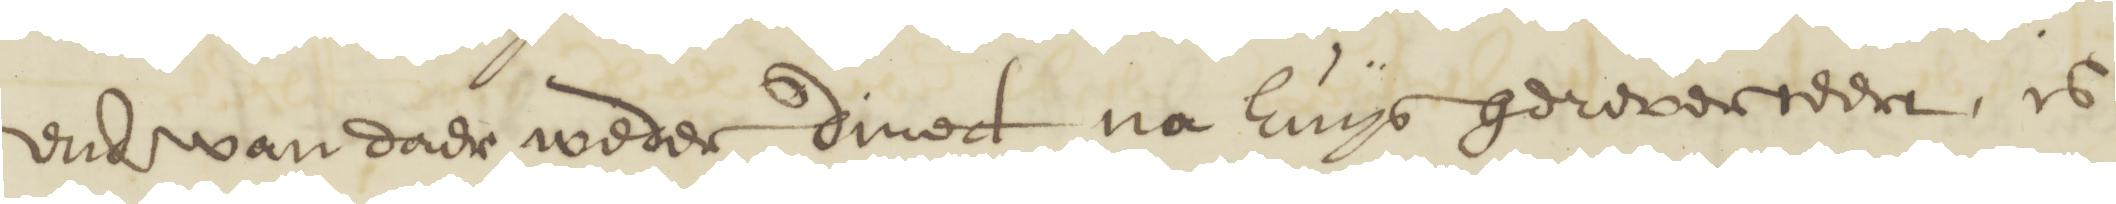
ende van daer weder direct na huijs gereverteert, is
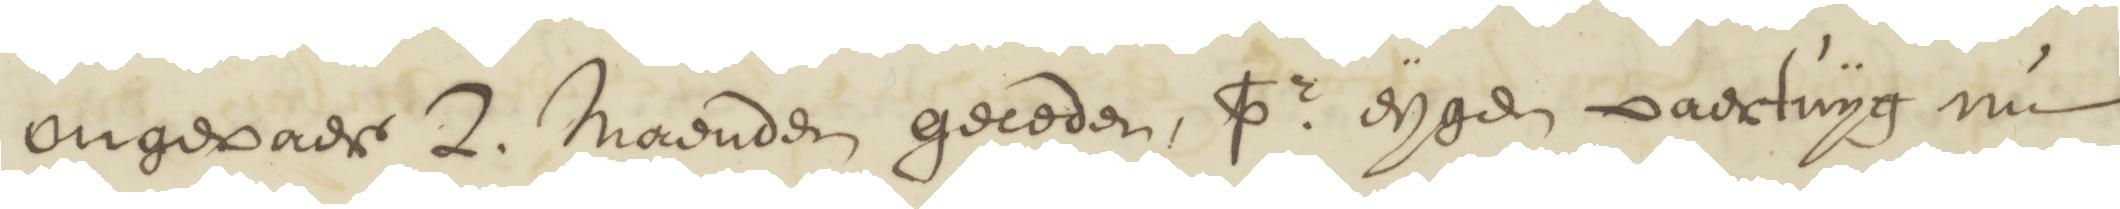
ongevaer 2. maenden geleden, p.r eijgen vaertuijg nu
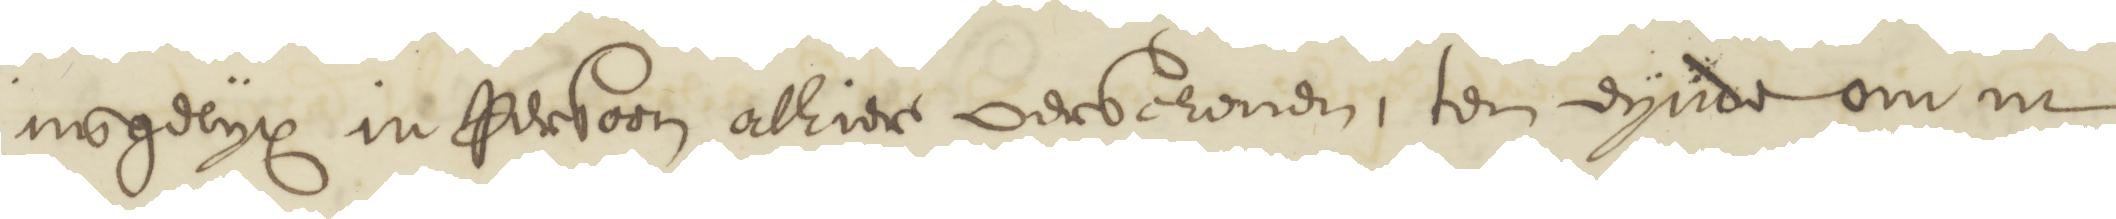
insgelijx in persoon alhier verschenen, ten eijnde om in
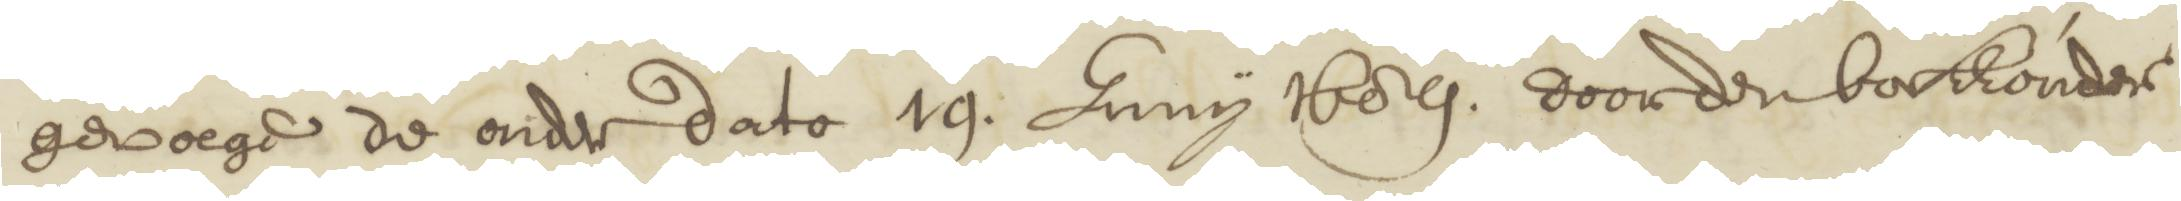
gevoegd de onder dato 19. Iunij 1689. door den boekhouder
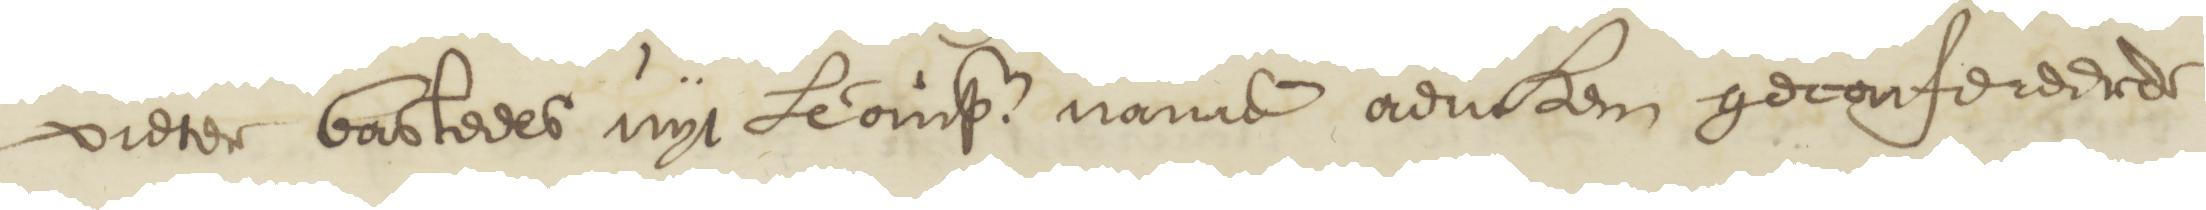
pieter basteels uijt scomp.n name aen hem geconfereerde
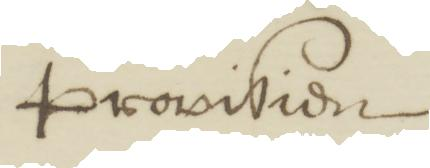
provisien
